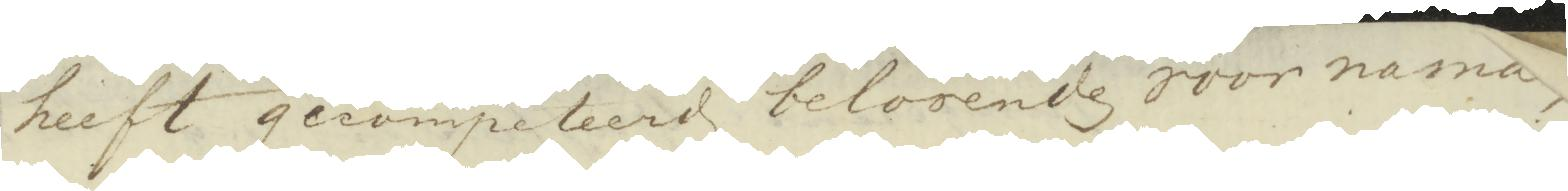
heeft gecompeteerd belovende voor nama
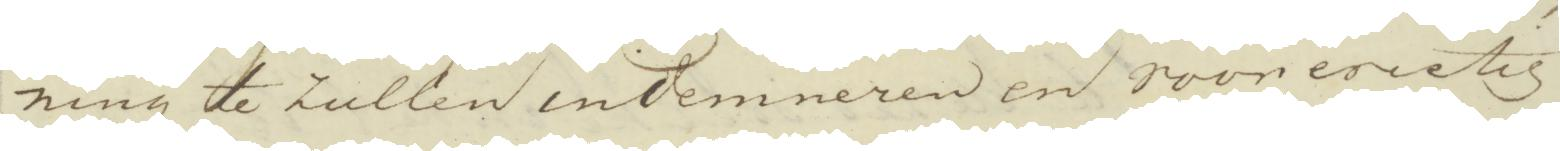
ning te zullen indemneren en voor evictie
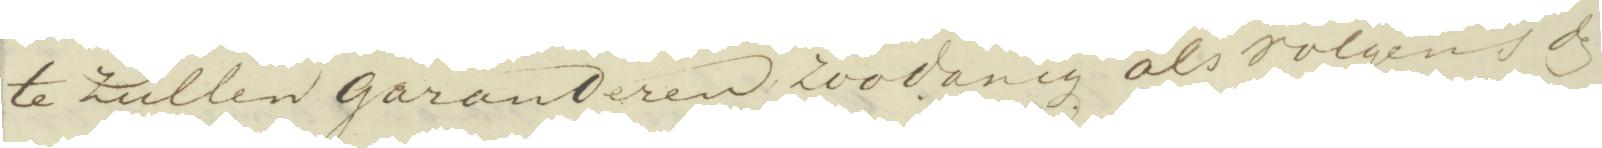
te zullen garanderen, zoodanig als volgens de
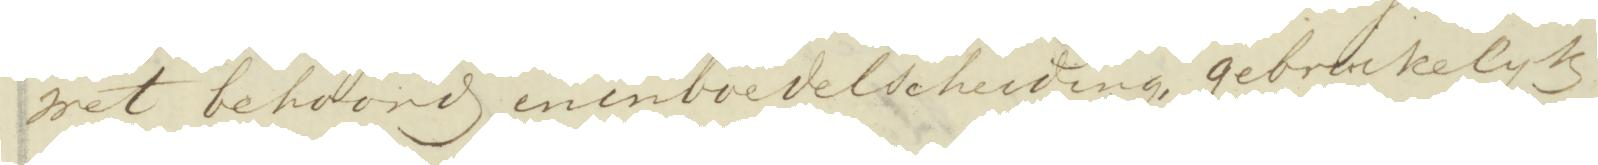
wet behoord eninboedelscheiding, gebruikelyk
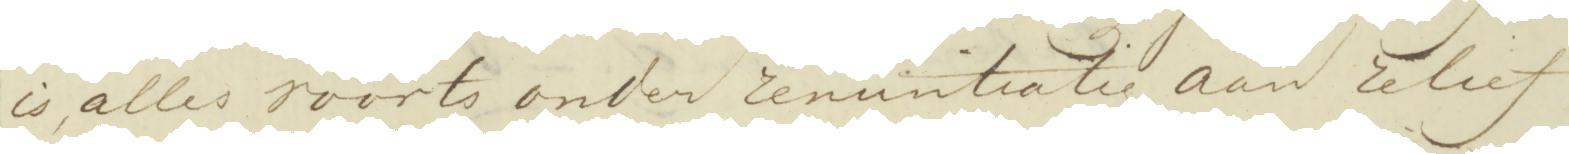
is, alles voorts onder renuntiatie aan relief
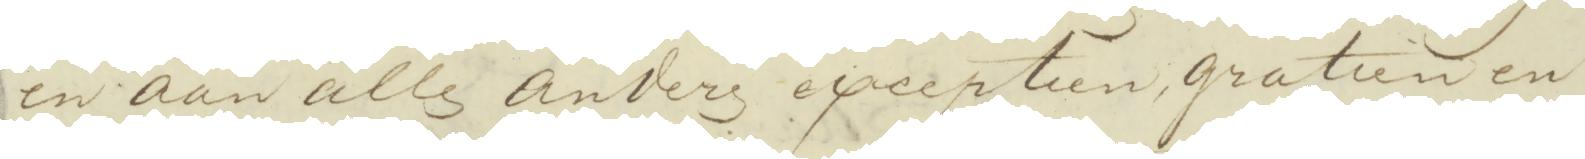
en aan alle andere exceptien, gratien en
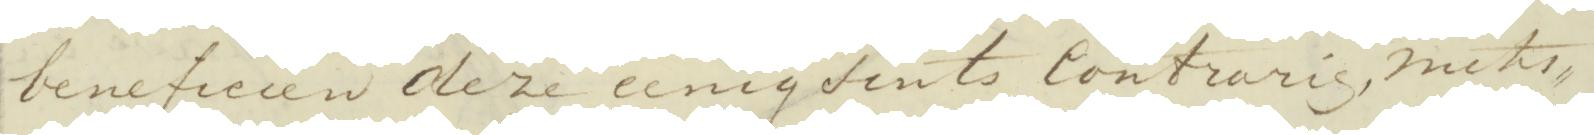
beneficien deze eenigsints contrarie, mits„
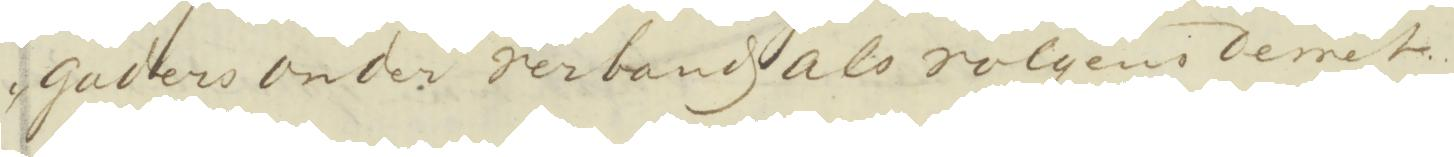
„gaders onder verband als volgens de wet.
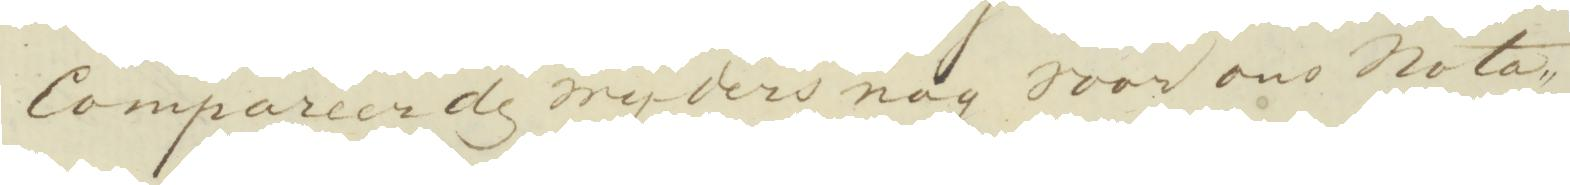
Compareerde wijders nog voor ons Nota„
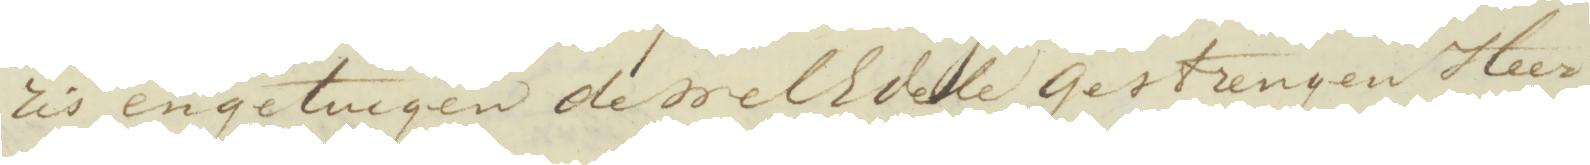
ris engetuigen de welEdele gestrengen Heer
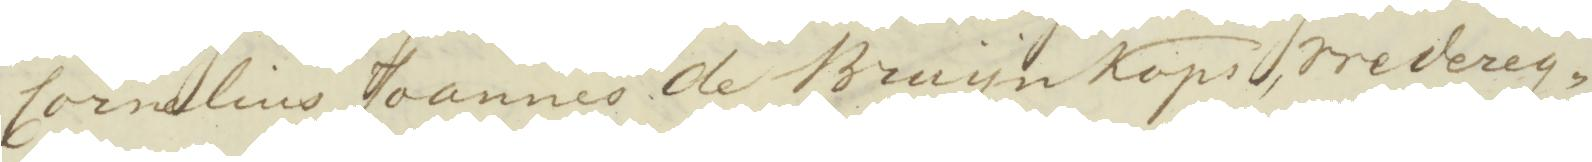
Cornelius Joannes de Bruijn Kops, Vredereg„
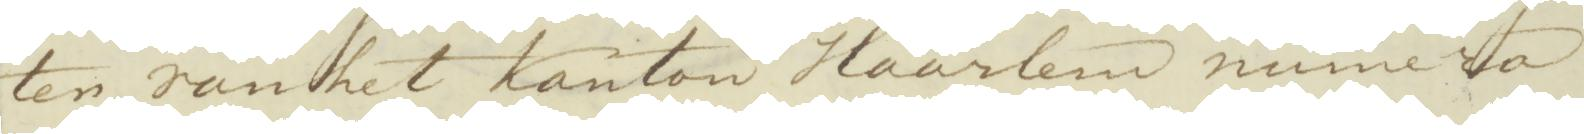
ter van het Kanton Haarlem numero
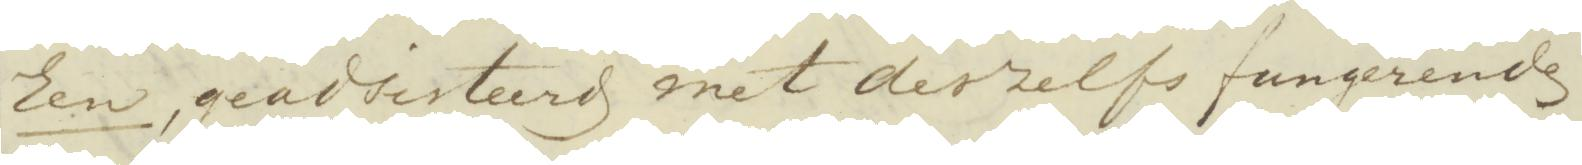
Een, geadsisteerd met deszelfs fungerende
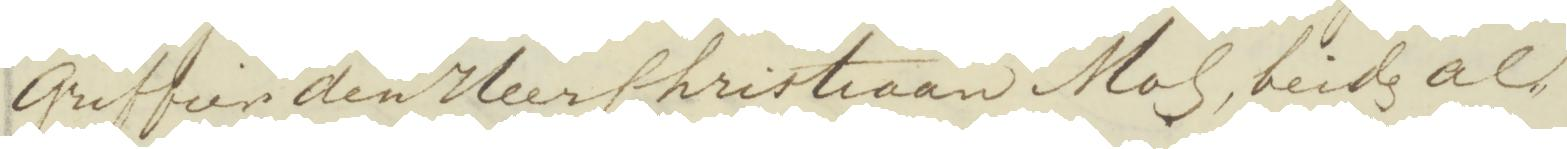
Griffier den Heer Christiaan Mol, beide al„
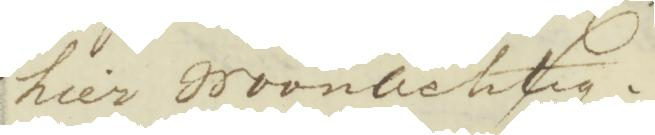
hier woonachtig.
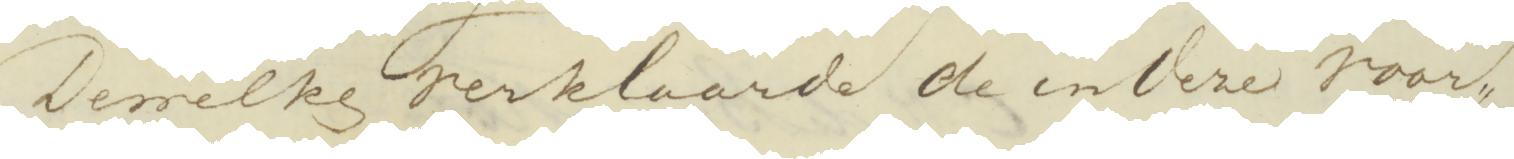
Dewelke verklaarde de in deze voor„
